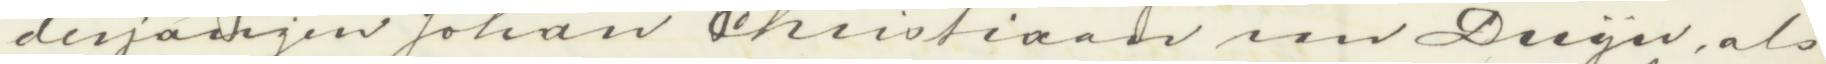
derjarigen Johan Christiaan van Duijn, als
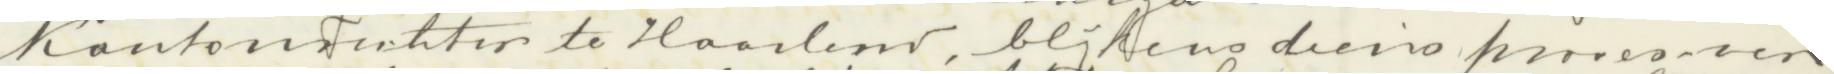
Kantonrechter te Haarlem, blijkens diens proces-ver
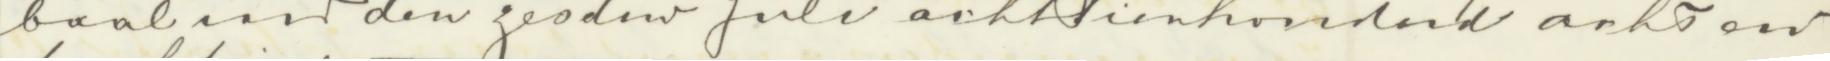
baal van den zesden Juli achttienhonderd acht en
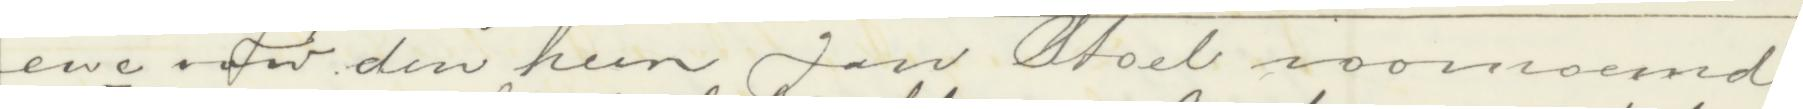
en e van den heer Jan Stoel voornoemd
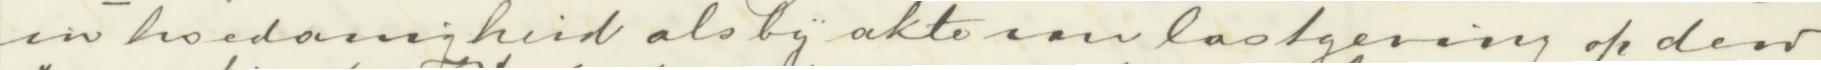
in hoedanigheid als bij akte van lastgeving op den
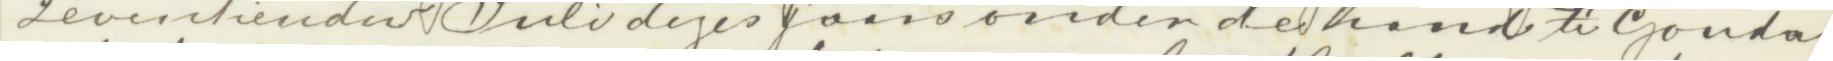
zeventienden Juli dezes jaars onder de hand te Gouda
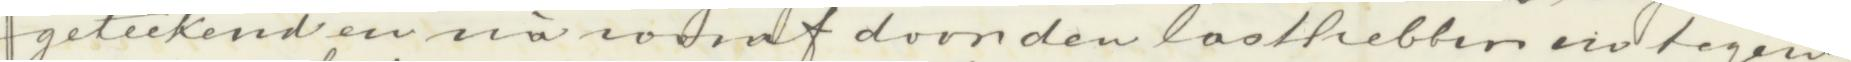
geteekend en nà vooraf door den lasthebber in tegen
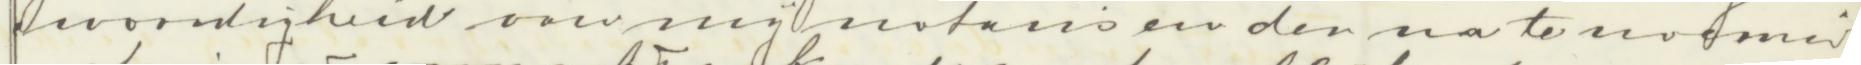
woordigheid van mij notaris en der na te noemen
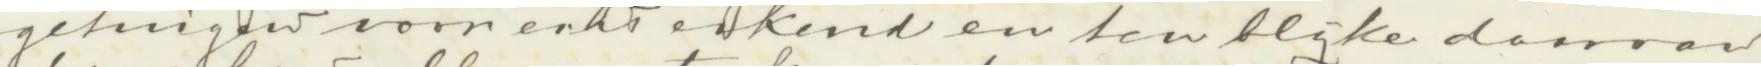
getuigen voor echt erkend en ten blijke daarvan
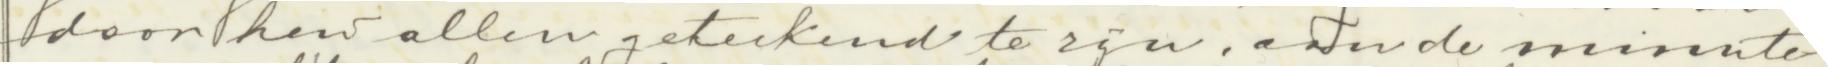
door hen allen geteekend te zijn, aan de minute
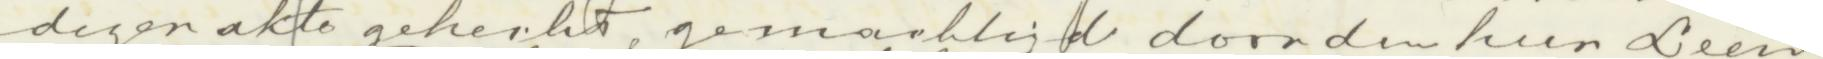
deser akte gehecht, gemachtigd door den heer Leen
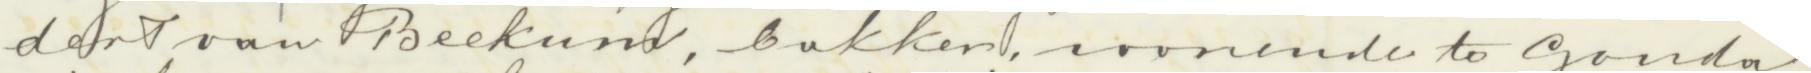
dert van Beekum, bakker, wonende te Gouda
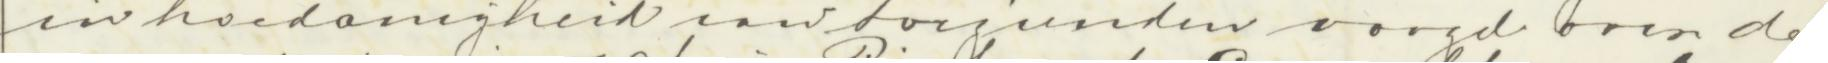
in hoedanigheid van toezienden voogd over de
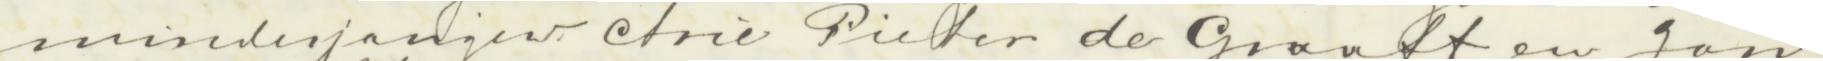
minderjarigen Arie Pieter de Graaff en Jan
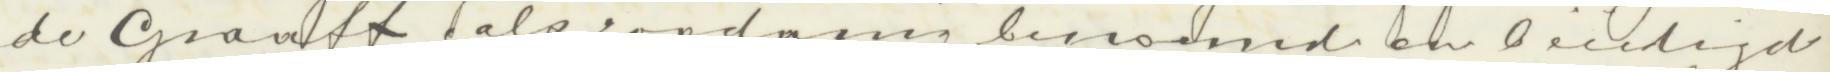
de Graaff als zoodanig benoemd en beeedigd
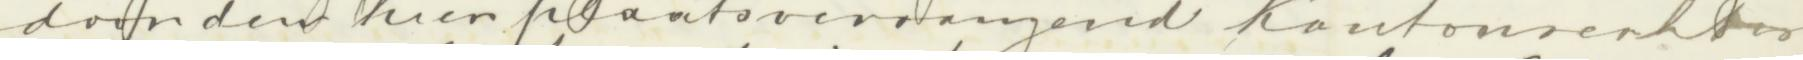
door den heer plaatsvervangend Kantonrechter
